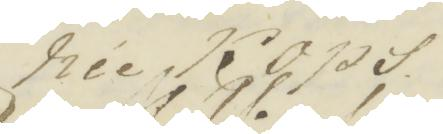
née Kops
